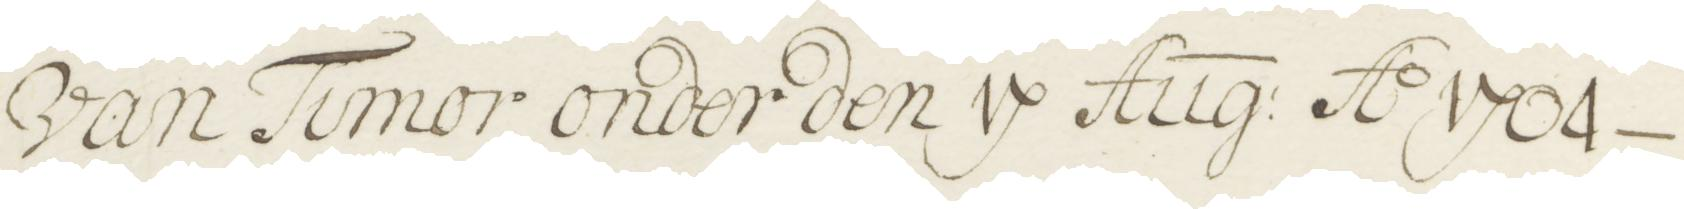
Van Timor onder den 17 Aug: Ao 1704 —
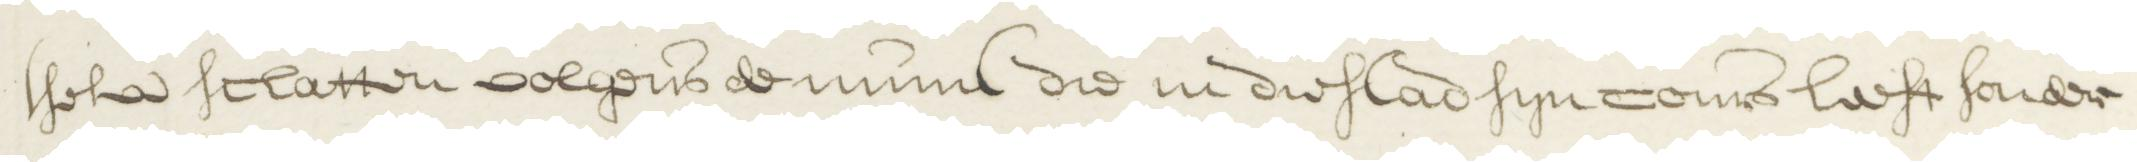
tselve schatten volgens de munt die in diestad sijn cours heeft sonder
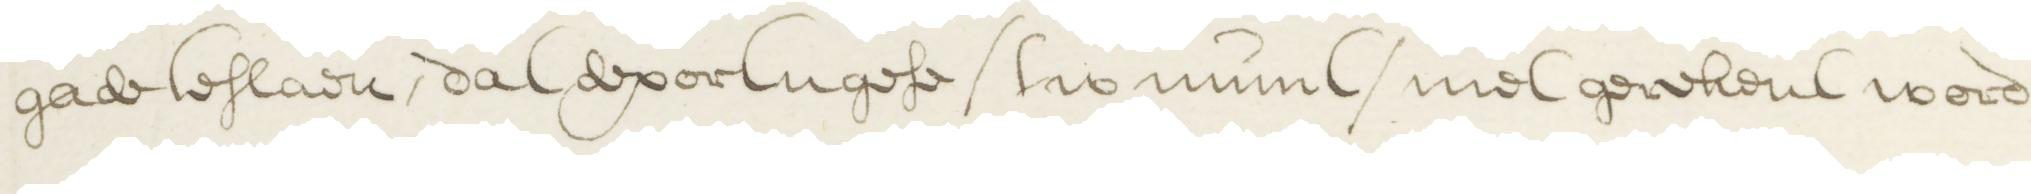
gade teslaen, dat deportugese /tw munt/ niet gerekent word
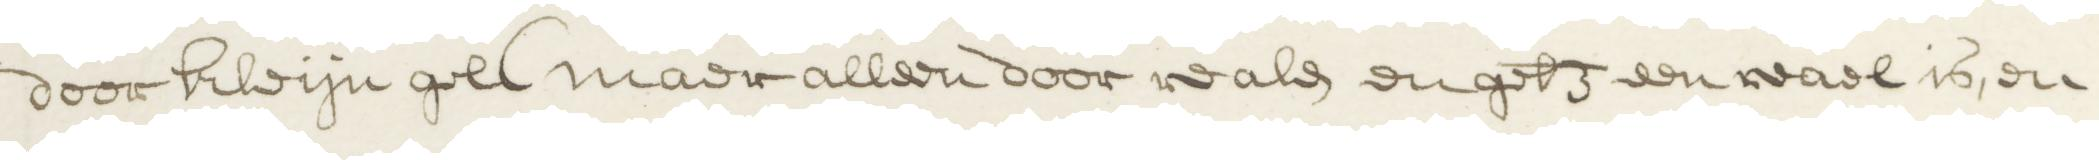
door kleijn gelt maer alleen door realen en gelijk een reael is, en
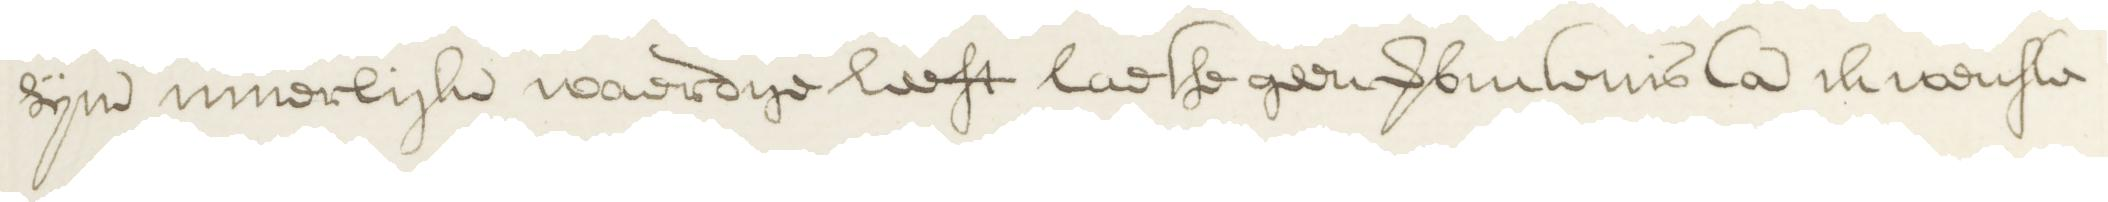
sijne innerlijke waerdye heeft laetse geen verbintenis ta ik wenste
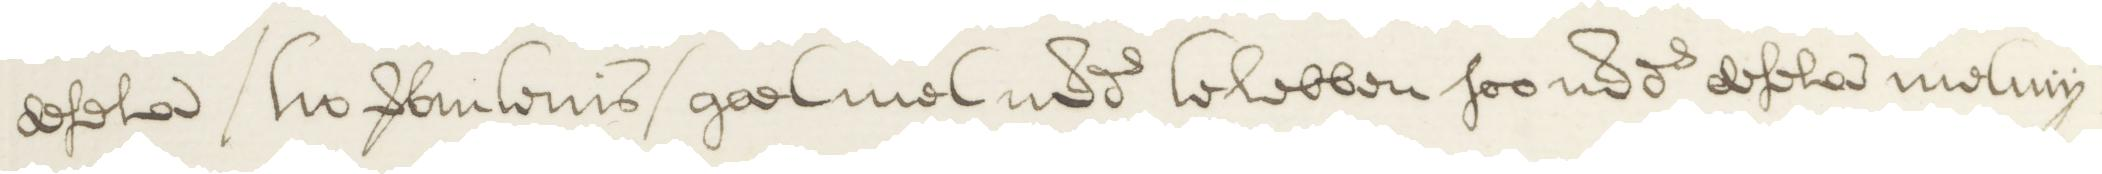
deselve /tw verbintenis/ goet met uEds te hebben soo uEds deselve met mij
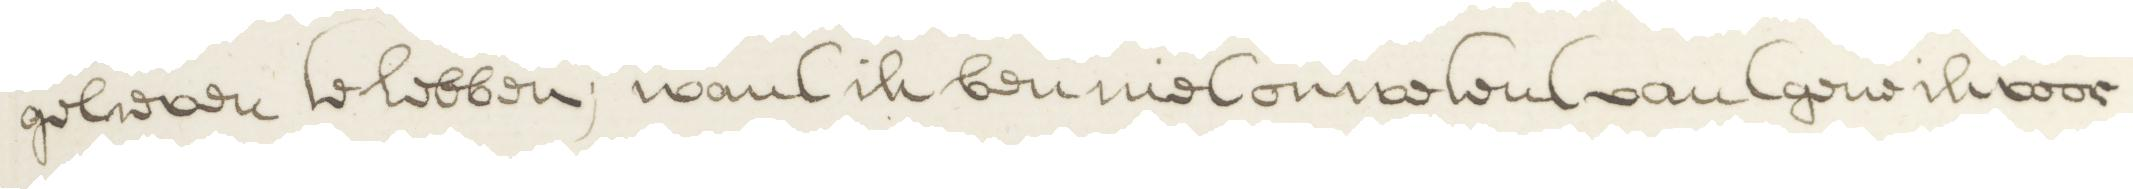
gelieven te hebben; want ik ben niet onwetent van 't gene ik voor
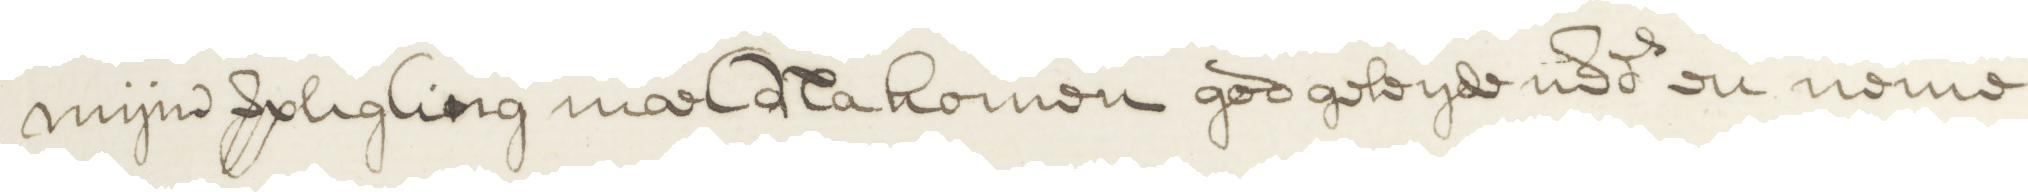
mijne verpligting moet Na komen god geleijde uEds en neme
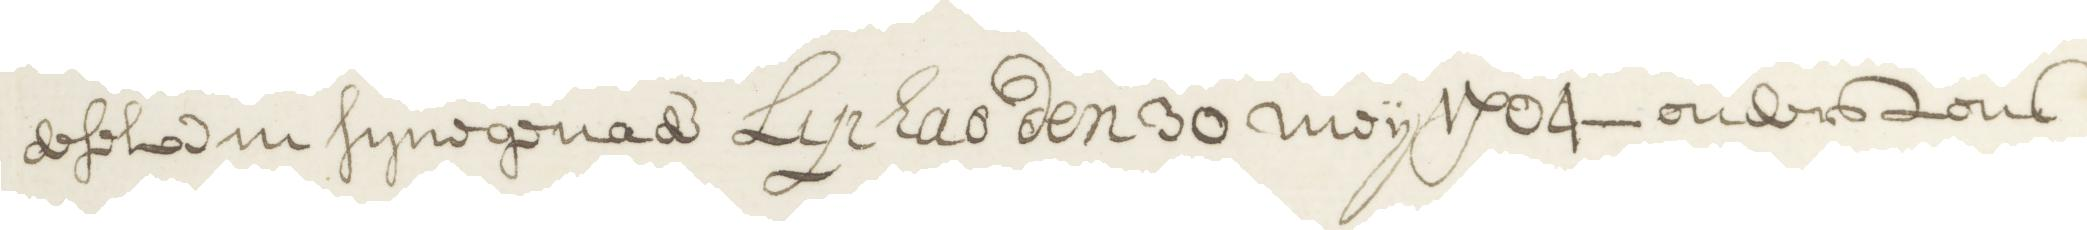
deselve in syne genade Liphau den 30 meij 1704 — onderstont
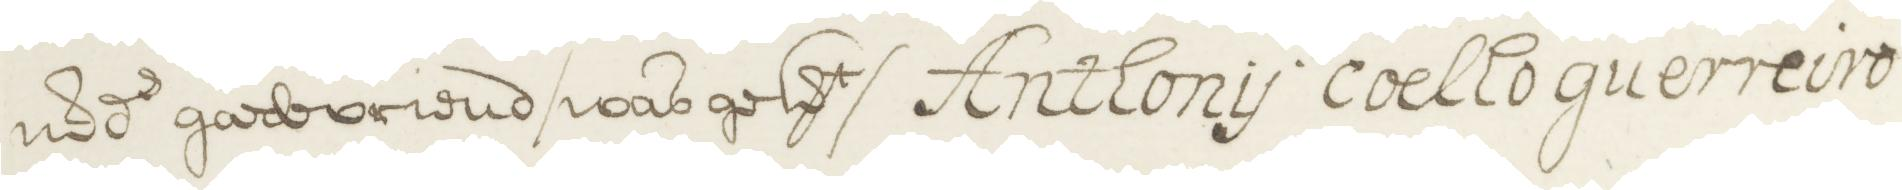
uEds goedevriend /was getvert/ Anthonij coelho guerreiro
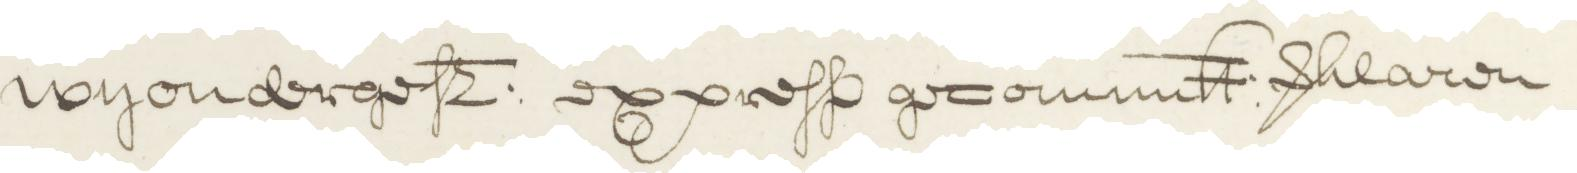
wij onder gesz: expresse gecommitt: verklaren
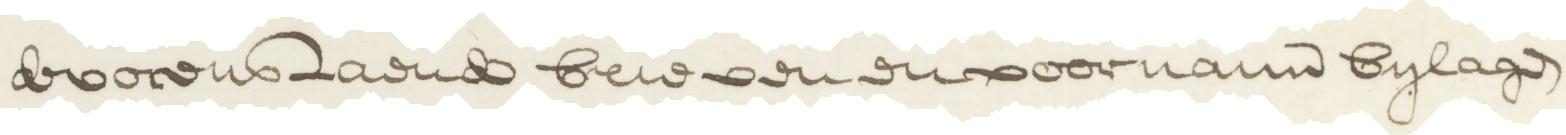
de vorenstaende brieven en voorname bylagen
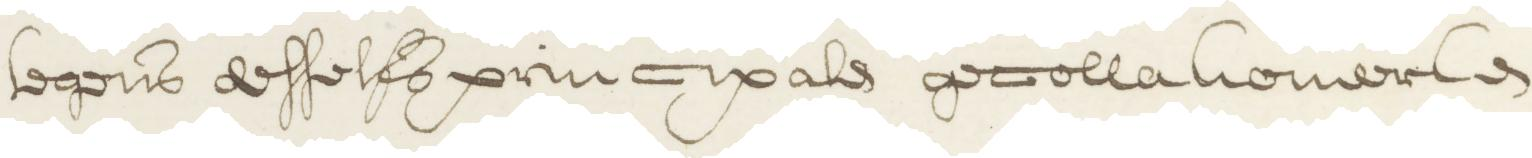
tegens desselfs principalen gecollationeert en
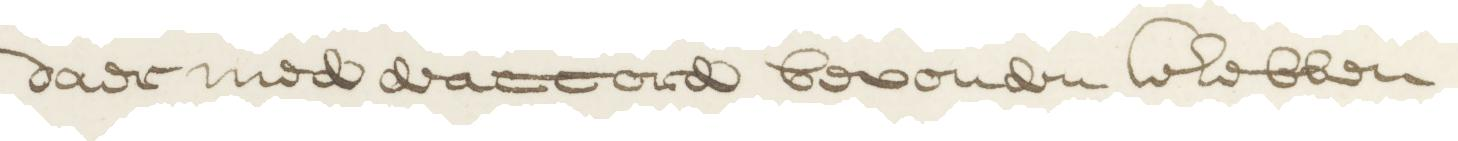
daer mede deaccorde bevonden tehebben
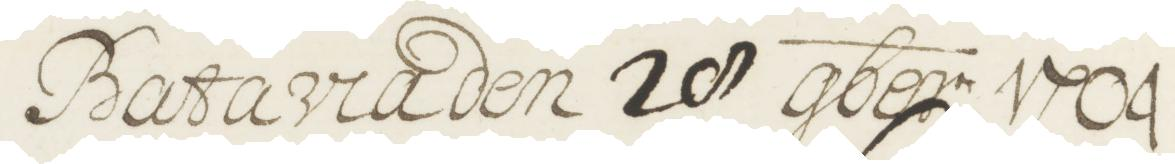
Batavia den 28 9ber: 1704
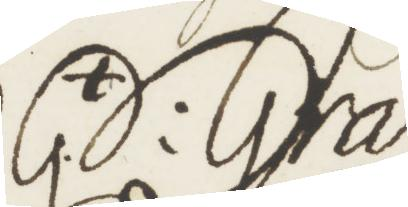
G.t Grave
